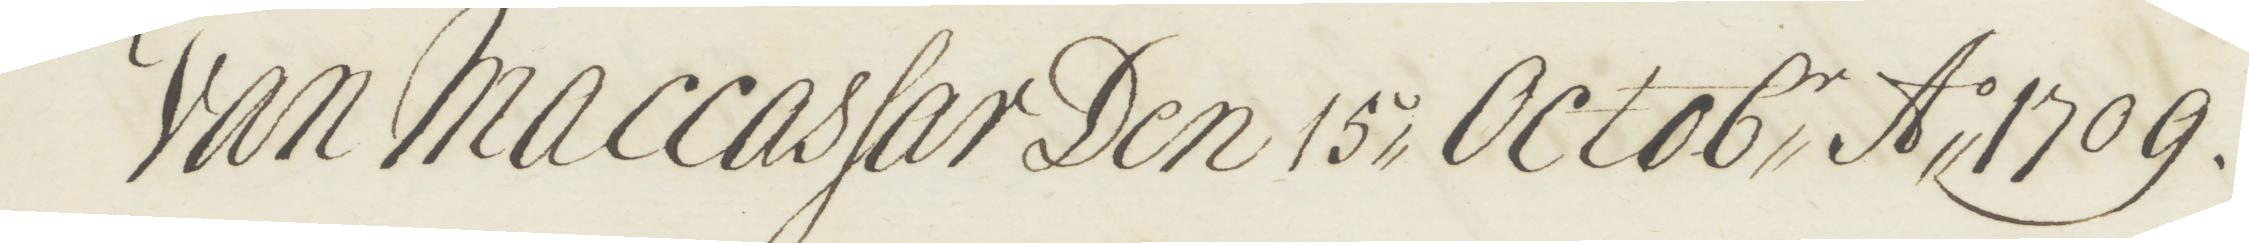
Van Maccassar Den 15„' Octob„r A„o 1709.
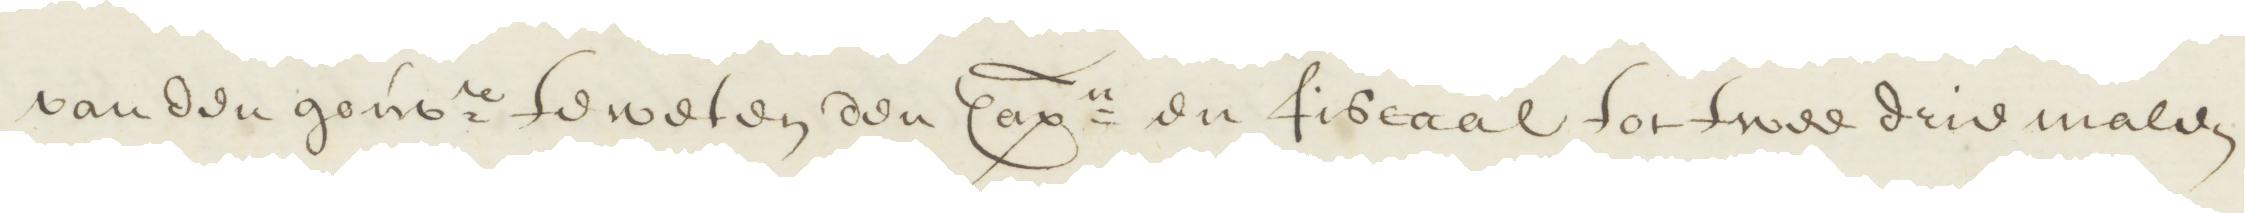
van den gouv=re te weten den Cap=n en fiscaal tot twee drie malen
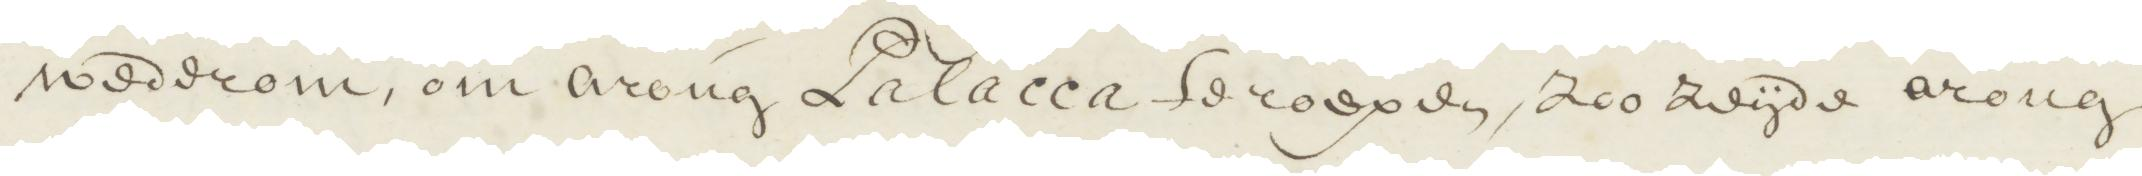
wederom, om arong Palacca te roepen, zoo zeijde arong
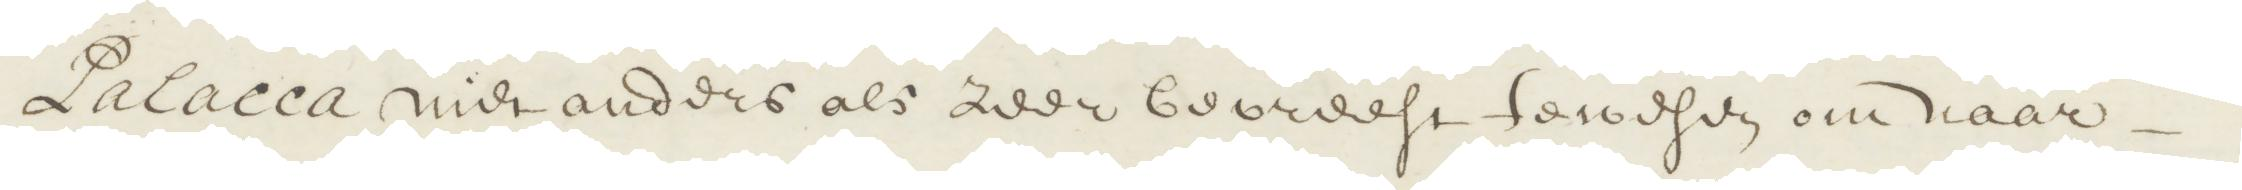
Palacca niet anders als zeer bevreest tewesen om naar —
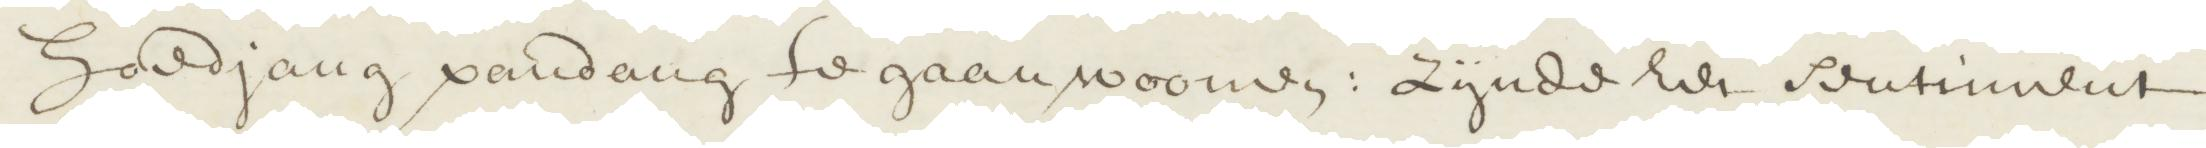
Hoedjang pandang te gaan woonen: zijnde het sentiment
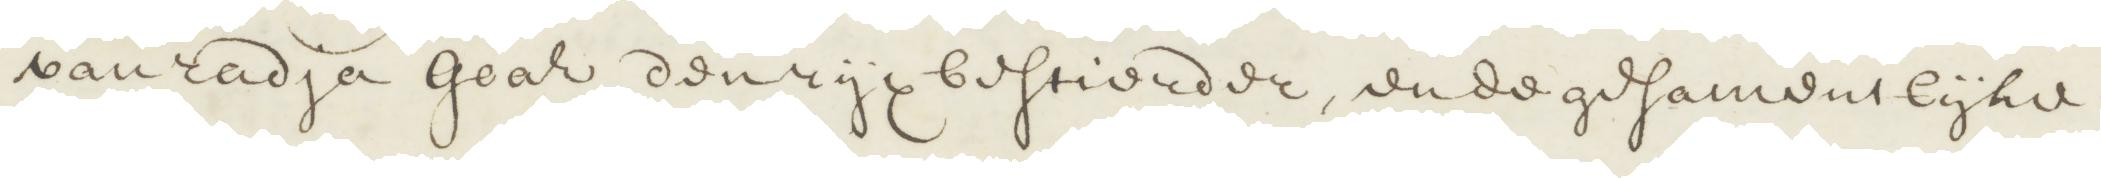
van radja goah den rijxbestierder, en de gesamentlijke
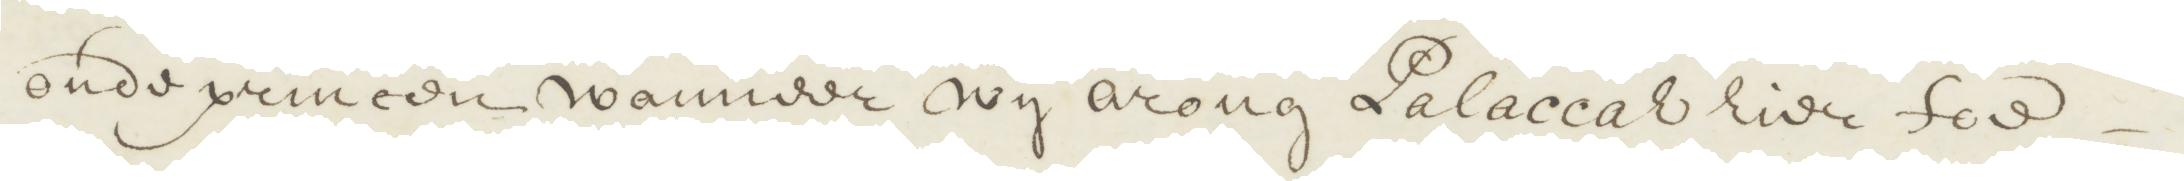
oude princen wanneer wij arong Palaccah hier toe —
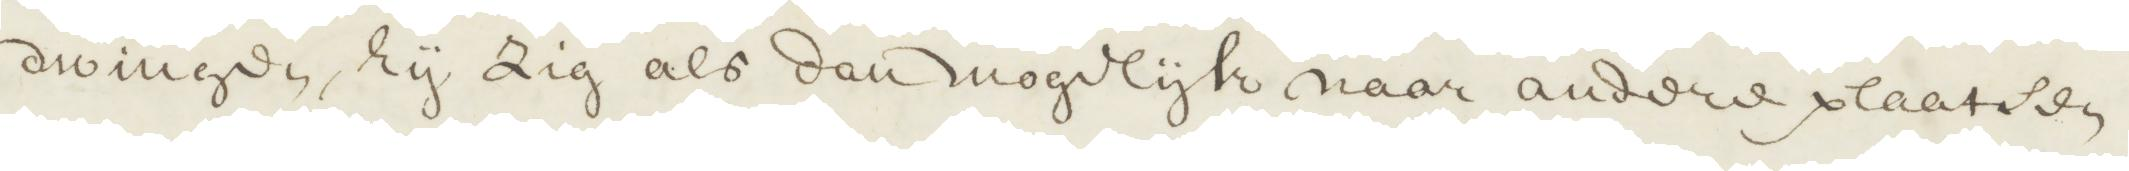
dwingen, hij zig als dan mogelijk naar andere plaatsen
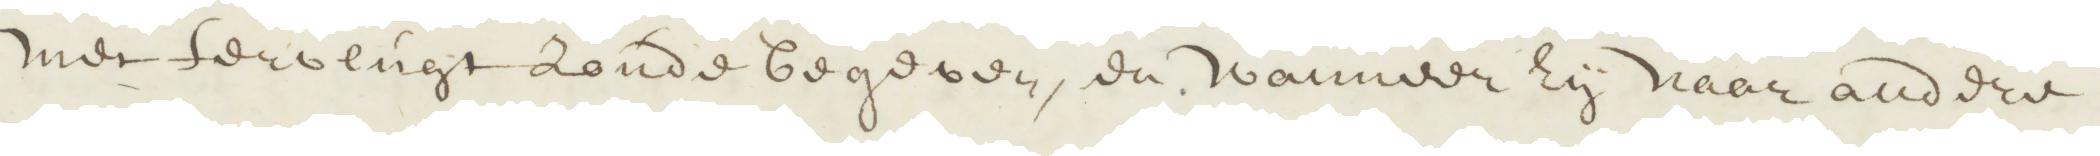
met ter vlugt zoude begeven, en wanneer hij naar andere
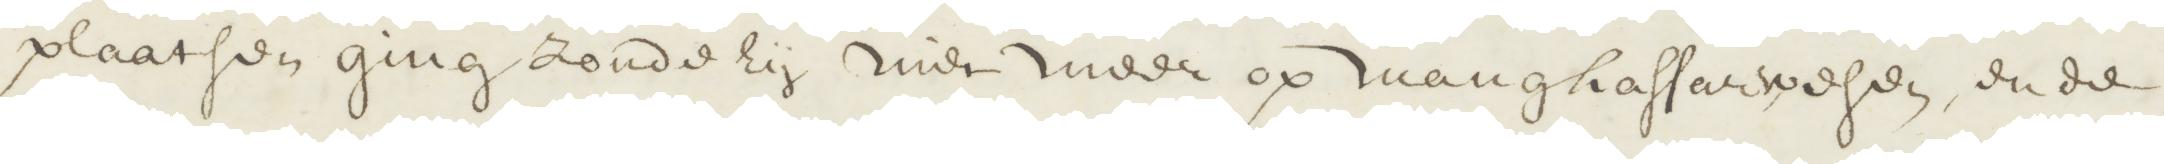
plaatsen ging zoude hij niet meer op mangkassar wesen, en de
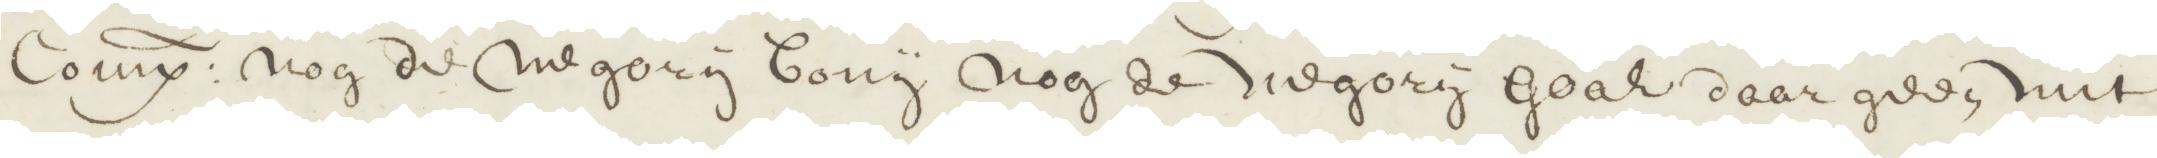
Comp: nog de negorij bonij nog de negorij goah daar geen nut
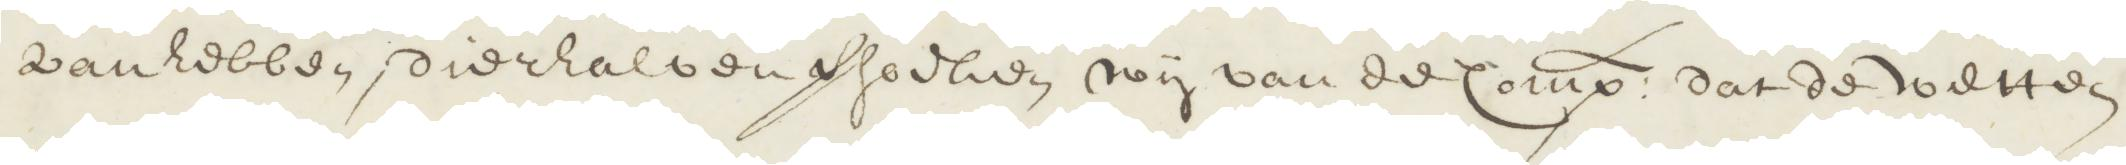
van hebben, dierhalven versoeken wij van de Comp: dat de wetten
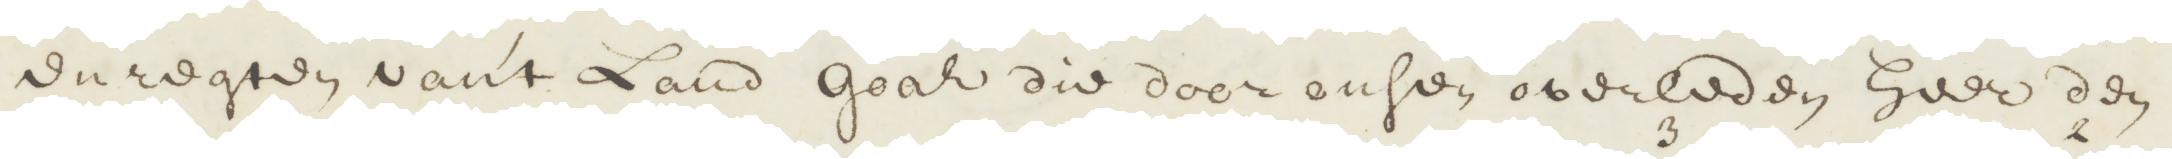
en regten van’t Land goah die door onsen overleden heer den
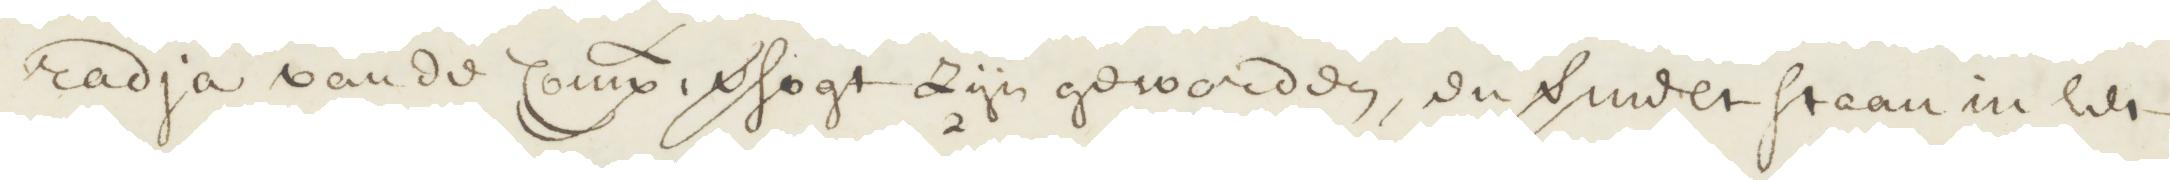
radja van de Comp: versogt zijn geworden, en vermelt staan in het
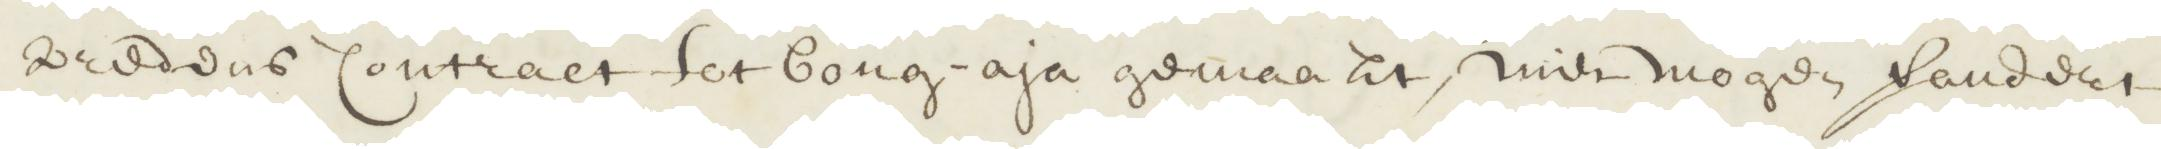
vredens Contract tot bong-aja gemaakt, niet mogen verandert
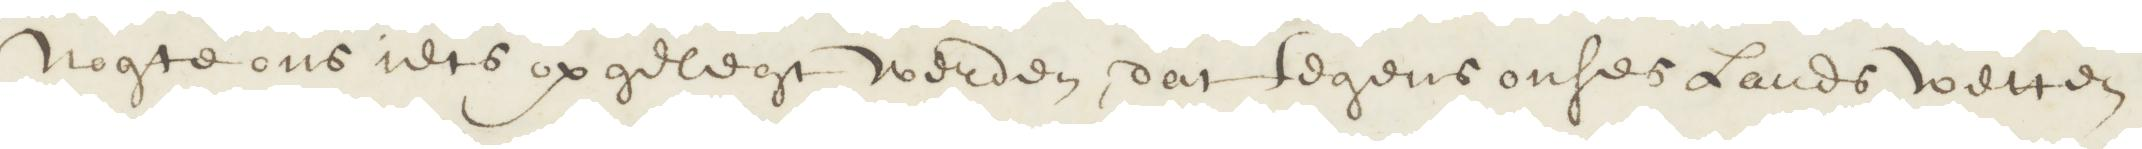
nogte ons iets op gelegt werden, dat tegens onses Lands wetten
